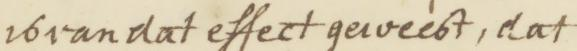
is van dat effect geweest, dat
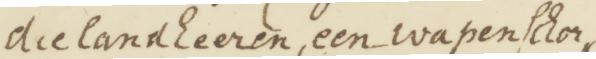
die landheeren, een wapenschor„
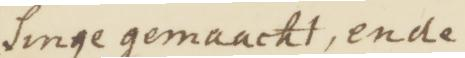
singe gemaackt, ende
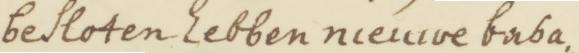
besloten hebben nieuwe baba„
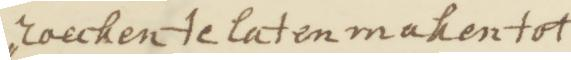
„roecken te laten maken tot
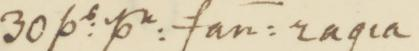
30 p:s p:r fan: ragia
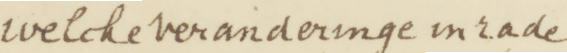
welcke veranderinge in rade
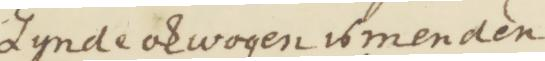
zynde overwogen is men den
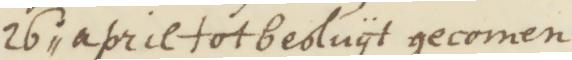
26„' april tot besluijt gecomen
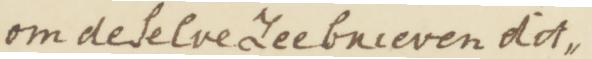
om deselve zeebrieven dit„
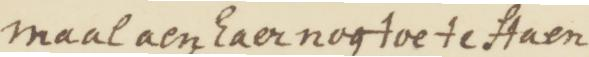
maal aen haer nog toe te staen
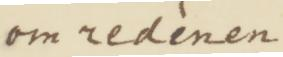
om redenen
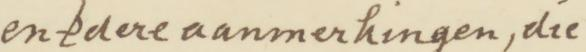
en verdere aanmerkingen, die
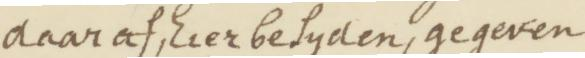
daar af, hier besyden, gegeven
